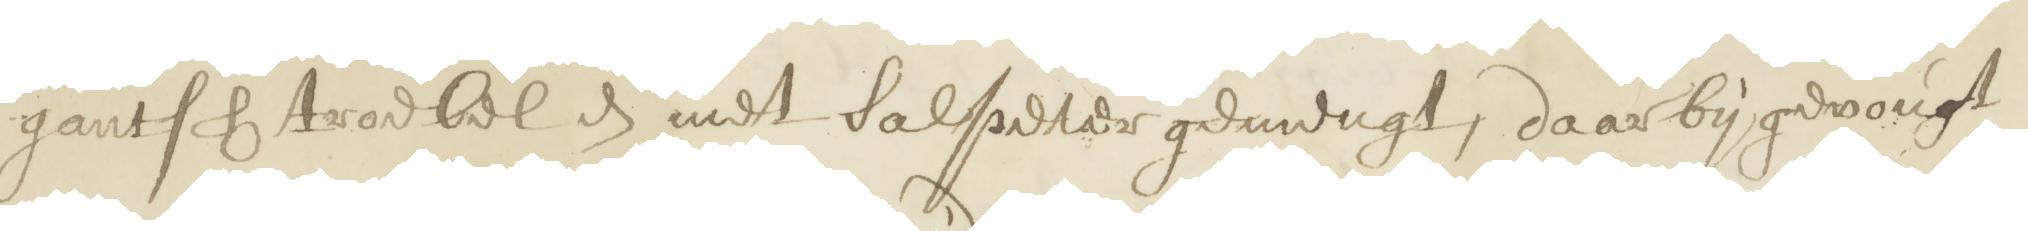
gantsch troebel en met salpeter gemengt, daar bij gevougt
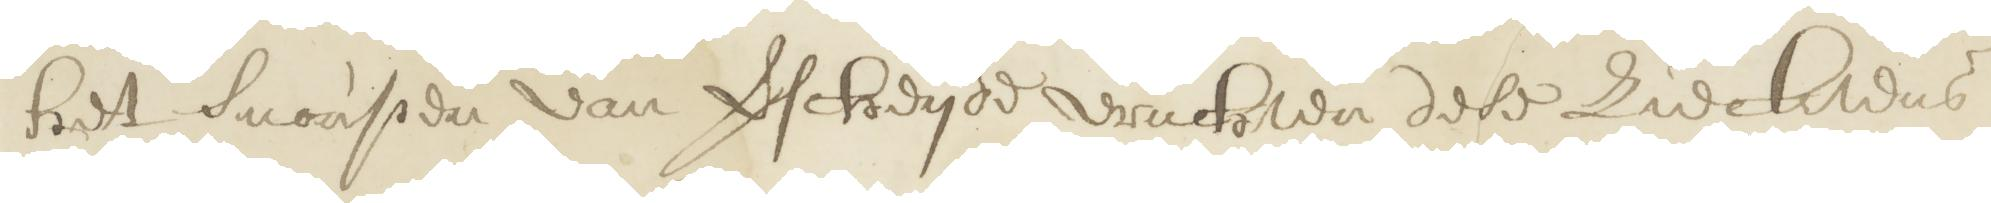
het snoupen van verscheijde vruchten dese ziecktens
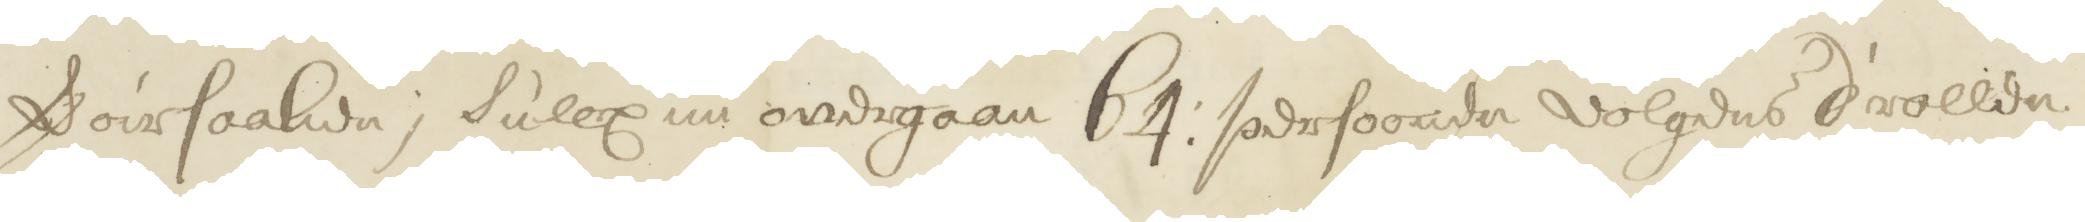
veroirsaaken; sulcx nu overgaan 64: persoonen volgens d' rollen
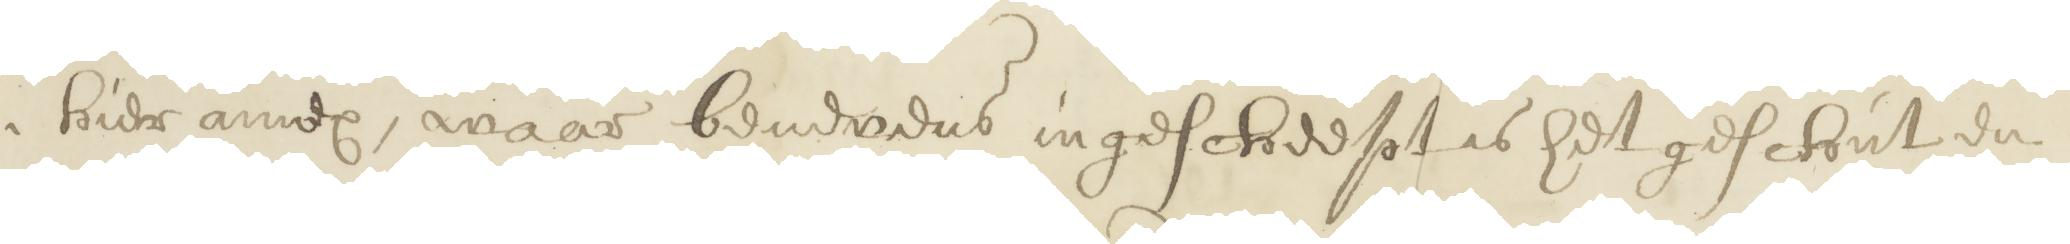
, hier annex, waar benevens ingescheept is het geschut en
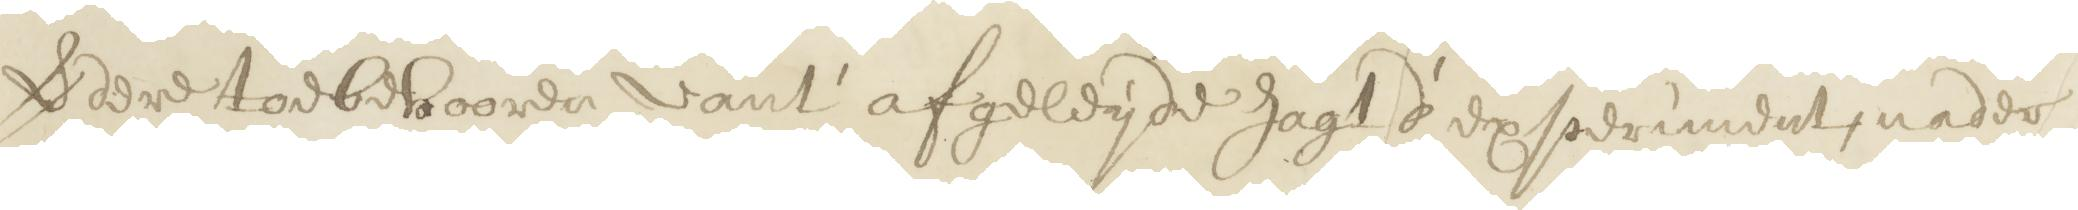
verdere toebehooren vant' afgeleijde Jagt d’experiment, nader
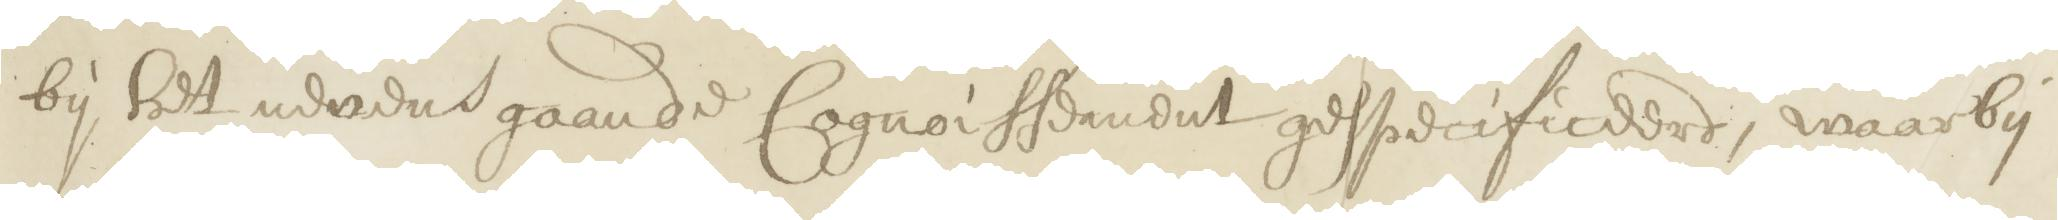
bij het nevensgaande Cognoissement gespecificeerd, waarbij
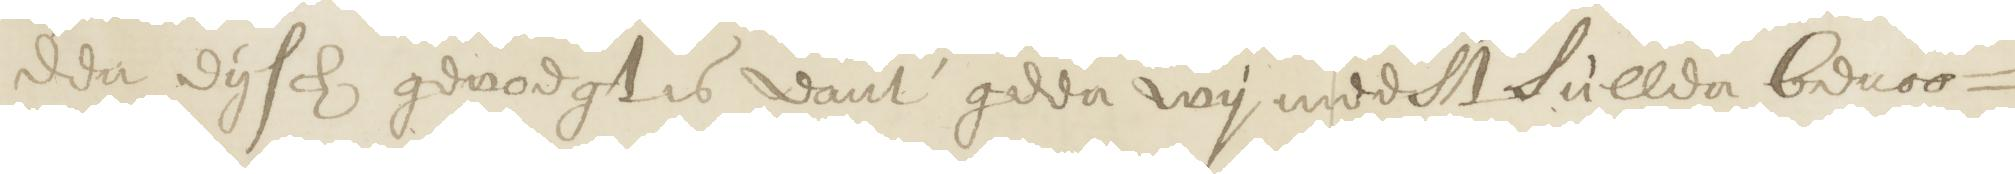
een eijsch gevoegt is vant' geen wij meest sullen benoo=
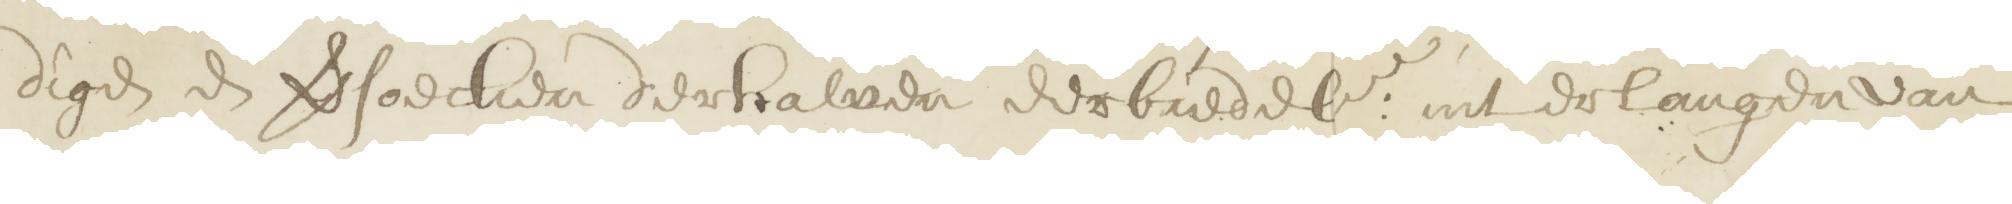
digen en versoecken derhalven eerbiedel: int' erlangen van
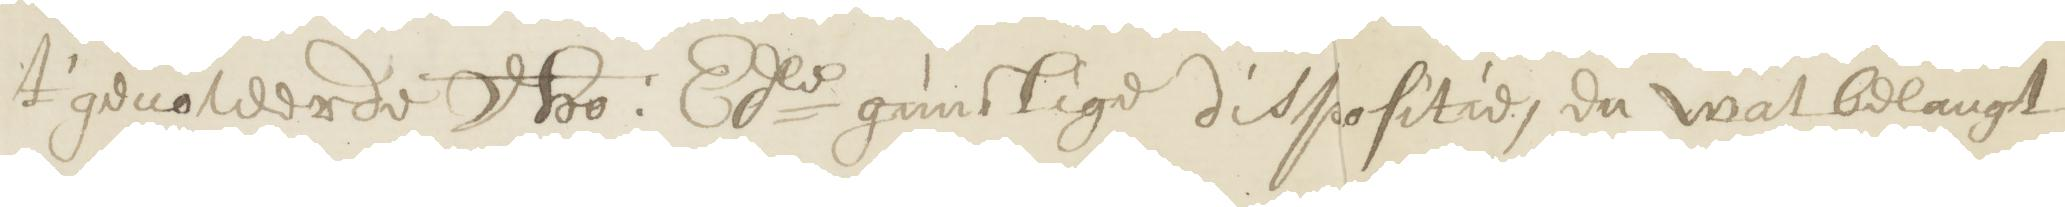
t' genoteerde Uho: Ed=le gunstige dispositie, en wat belangt
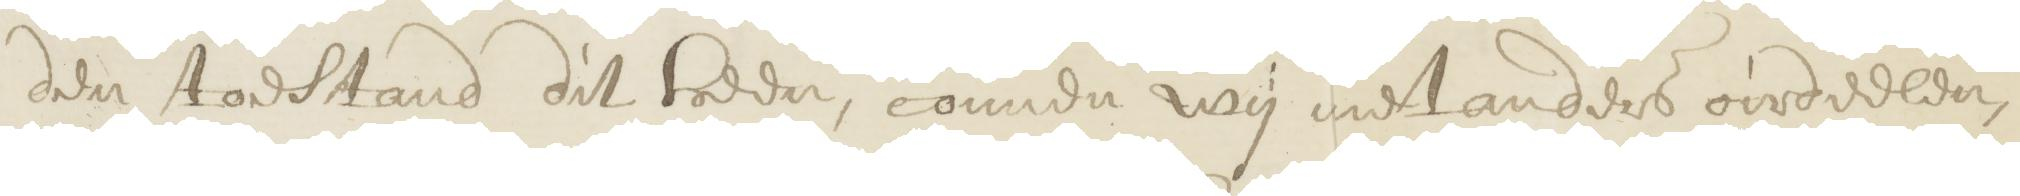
den toestand dit heen, connen wij niet anders oirdeelen,
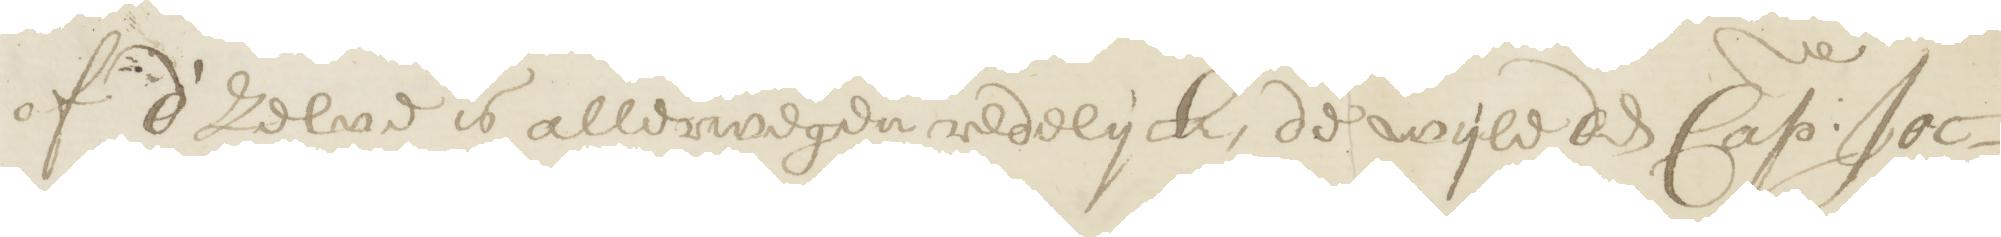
of d’ zelve is allerwegen redelijck, de wijle den Cap:ne Joc=
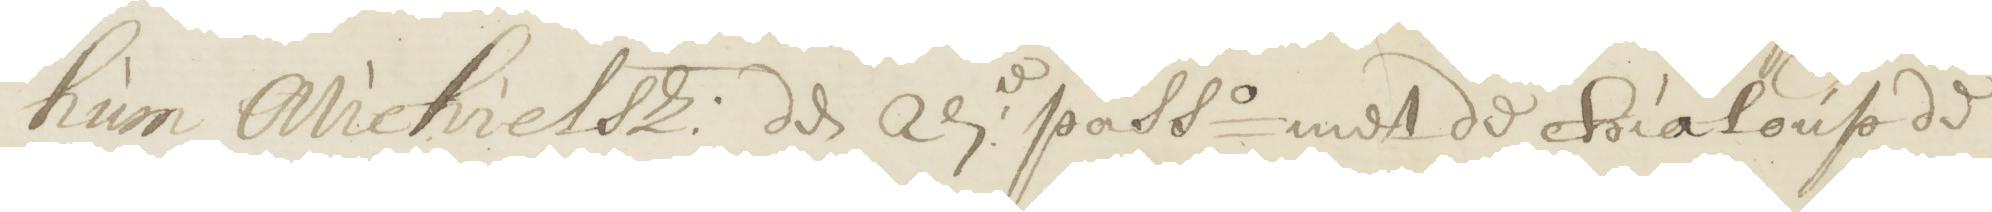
hum Michielsz: den 27:e pass=o met de chialoup de
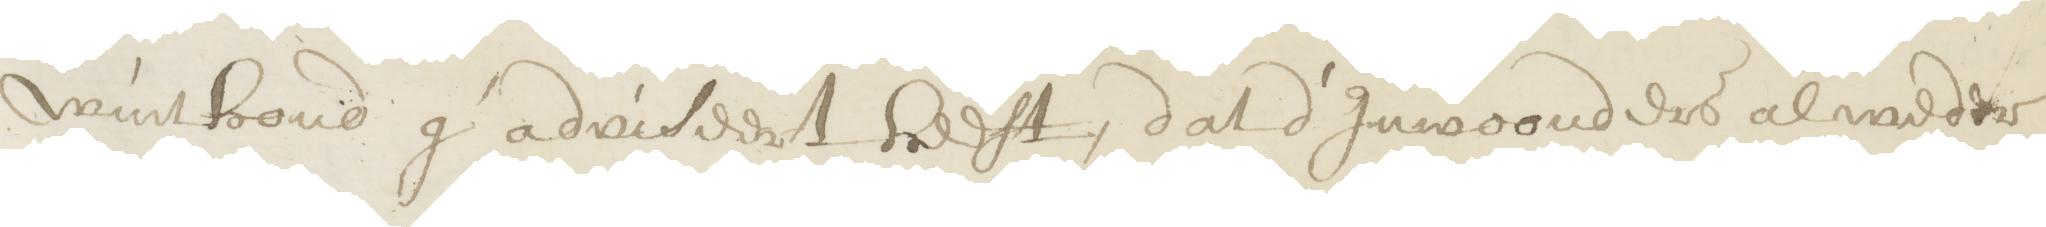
winthond g’adviseert heeft, dat d'Inwoonders alweder
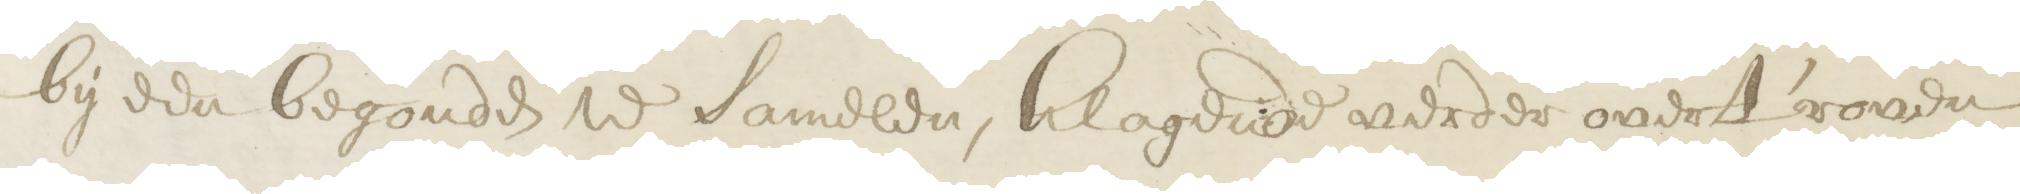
bij een begonden te samelen, klagende verder over t' roven
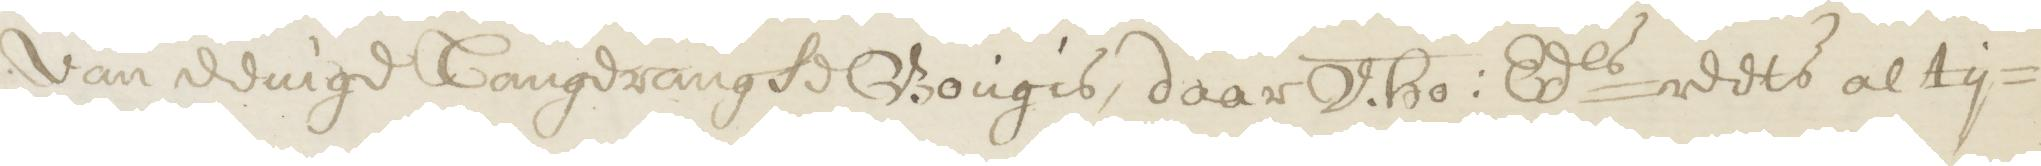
van eenige Tangerangse Bougis, daar U.ho: Ed=ls reets al tij=
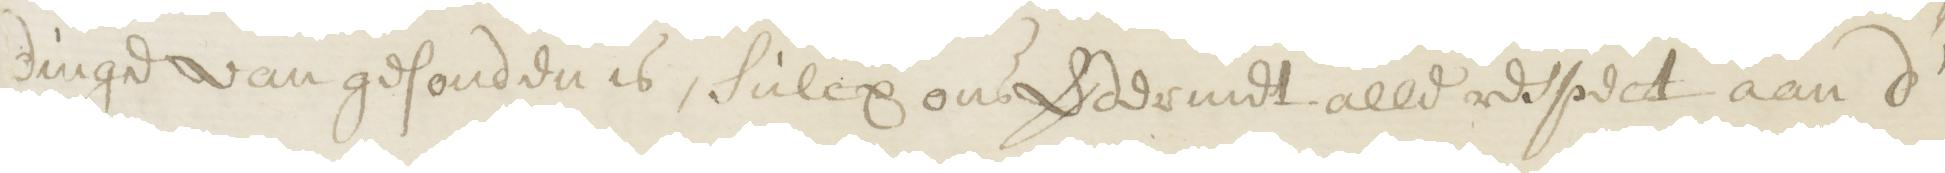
dinge van gesonden is, sulcx ons verder met alle respect aan d’
